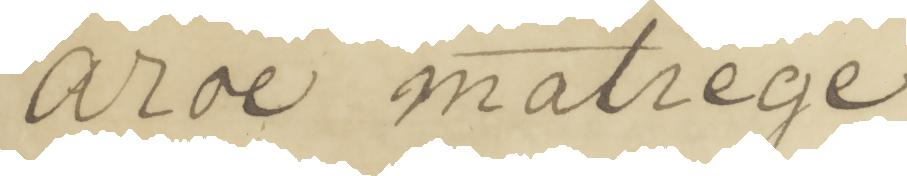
aroe matiege
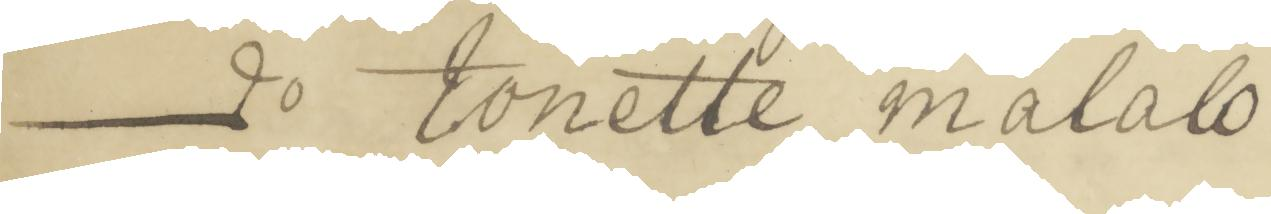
_o tonette malalo
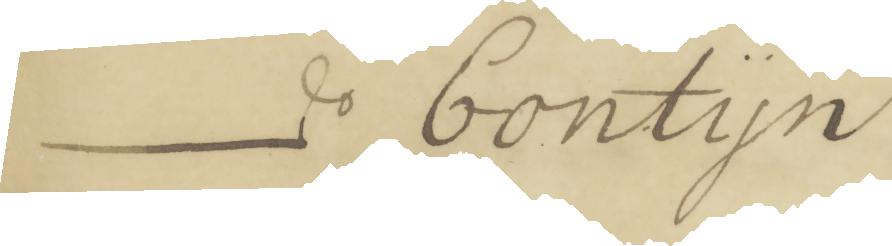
_o bontijn
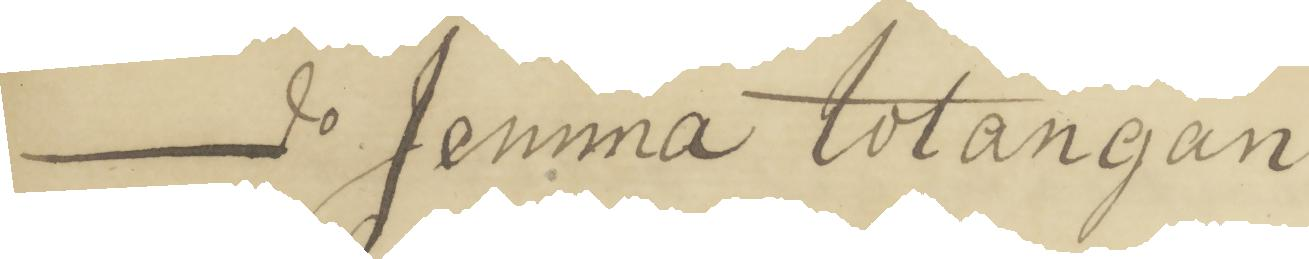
_o Jemma totangan
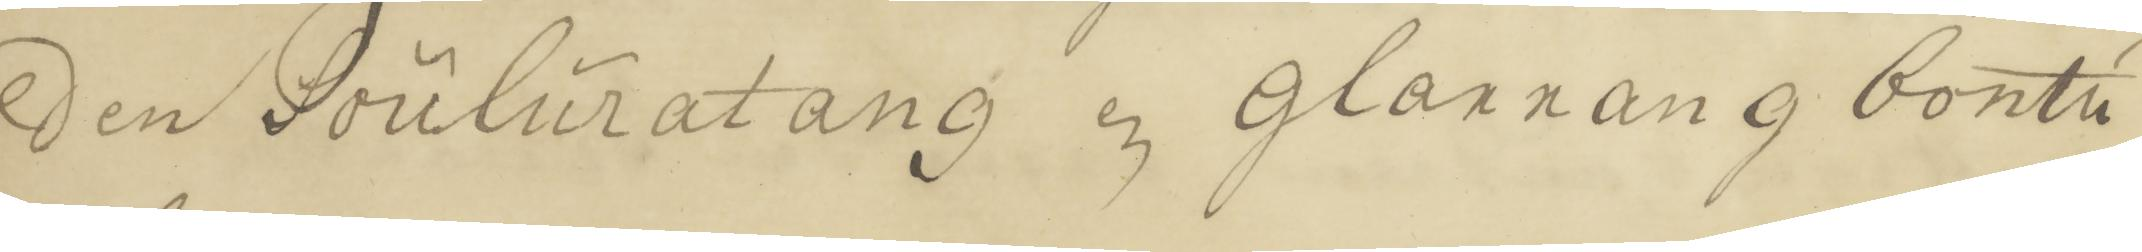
den souluratang en glarrang bontu
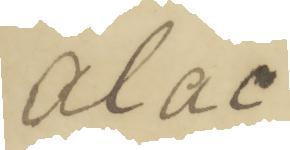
alac
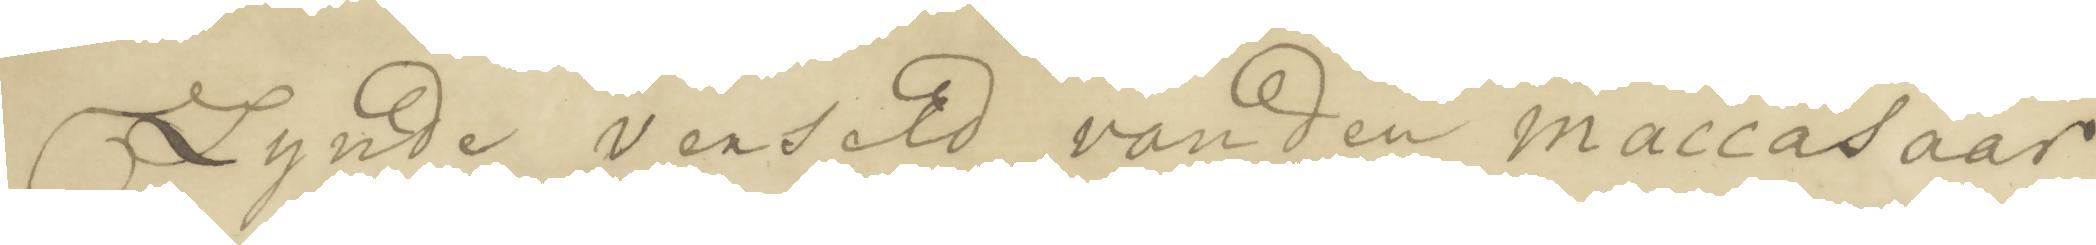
zynde verseld van den maccasaar
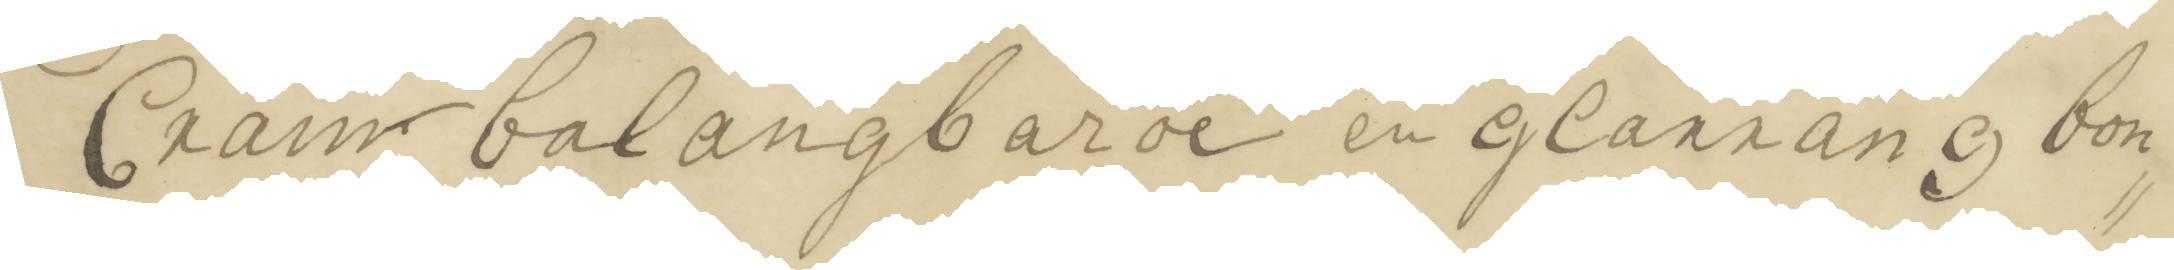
Crain balangbaroe en glarrang bon„
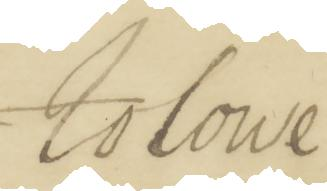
tolowe
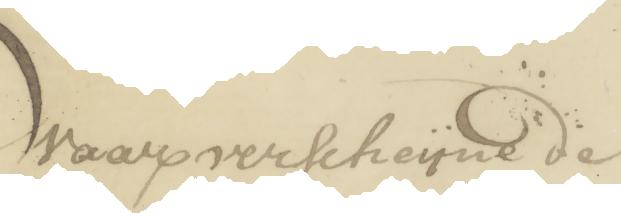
Waar verscheijne de
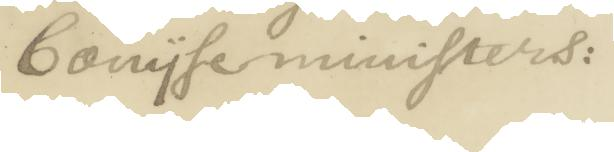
bonijse ministers:
